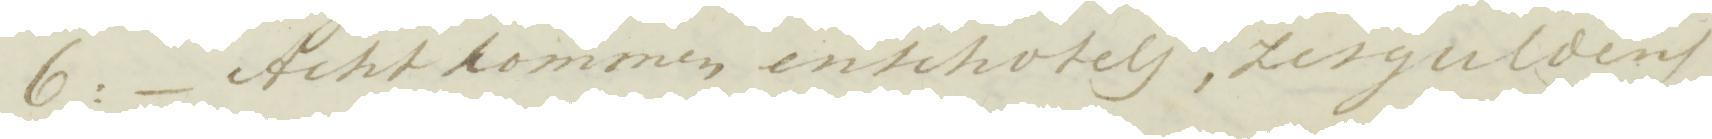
6: — Acht kommen enschotels, zes guldens
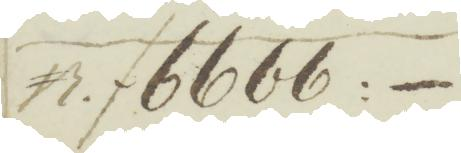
Tr. ƒ6666:—
